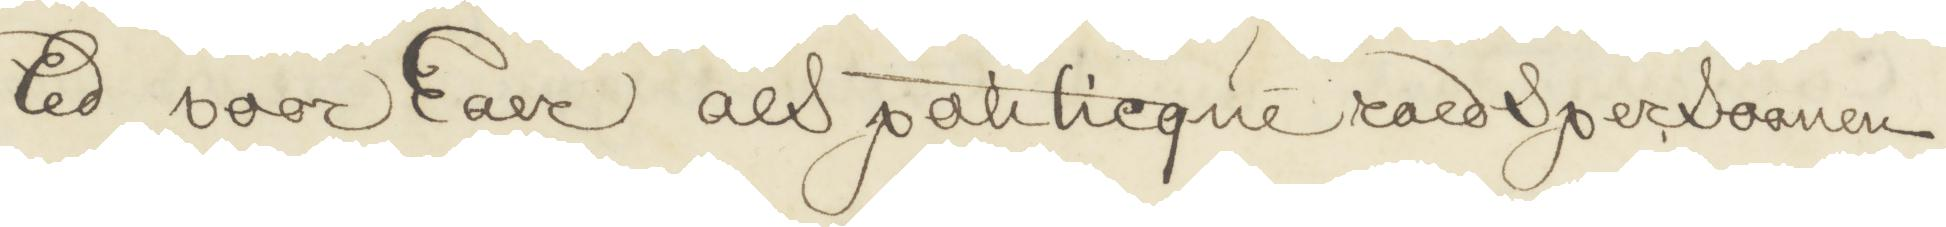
Eed voor haer als politicque raedspersoonen
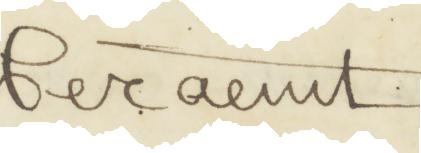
beraemt
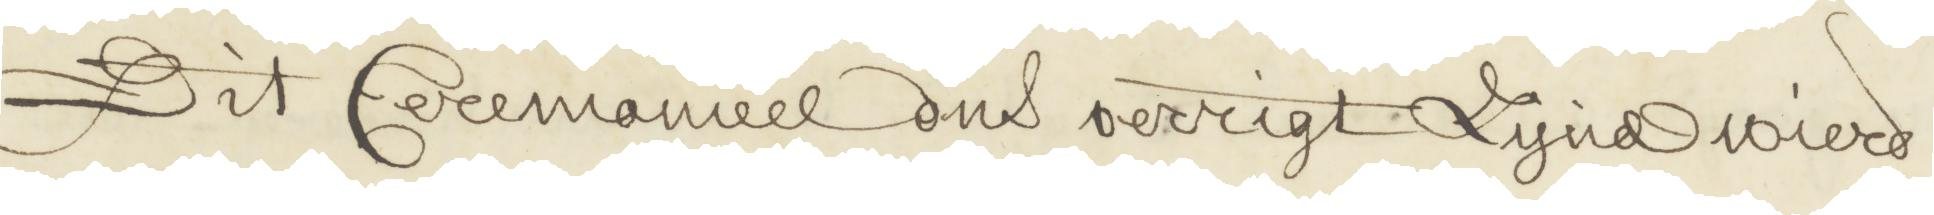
Dit ceremomeel dus verrigt zijnde wierd
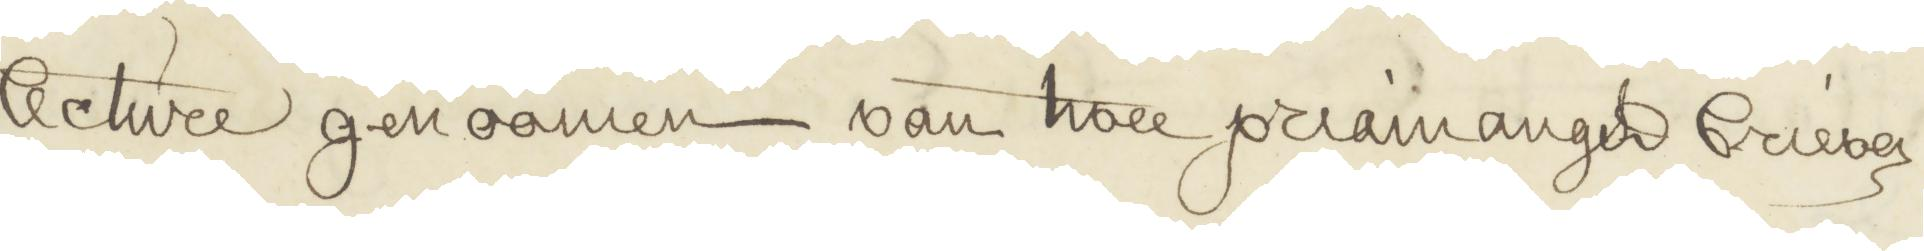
lecture genoomen van twee priamangse brieven
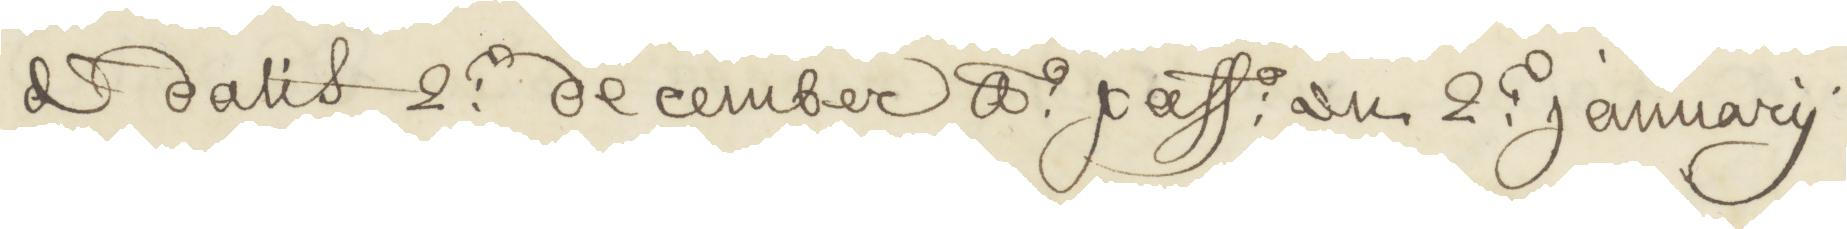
de datis 2:' december a:o pass:o en 2:' januarij
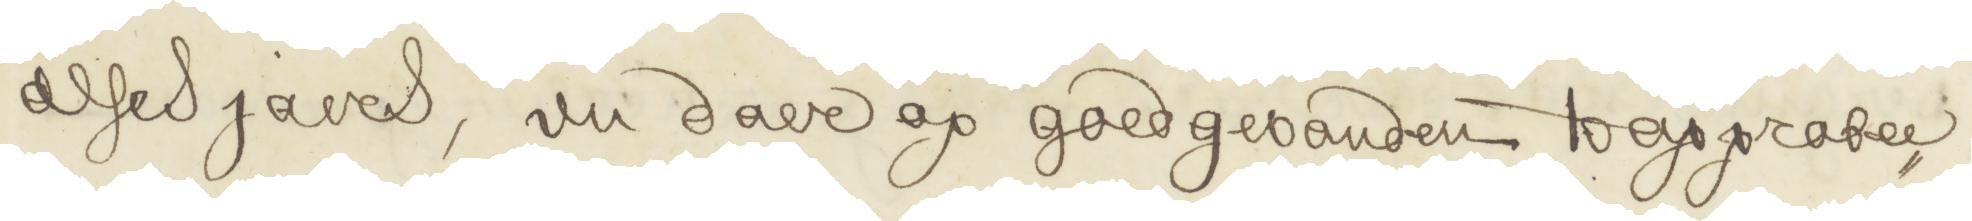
deses jaers, en daer op goedgevonden te approbee„
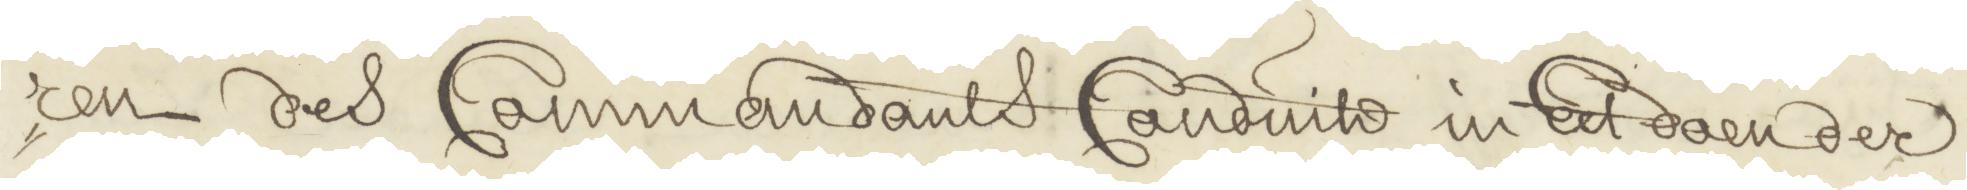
„ren des Commandants Conduite in het doen der
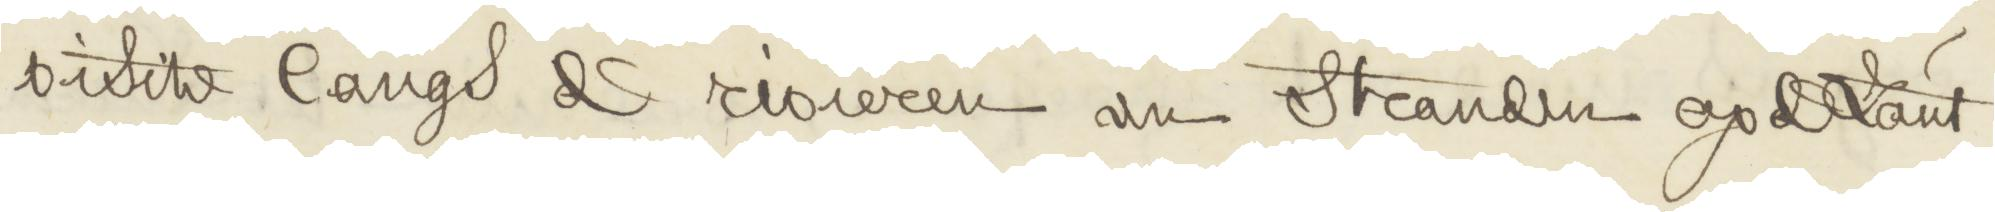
visite langs de rivieren en stranden op de zout
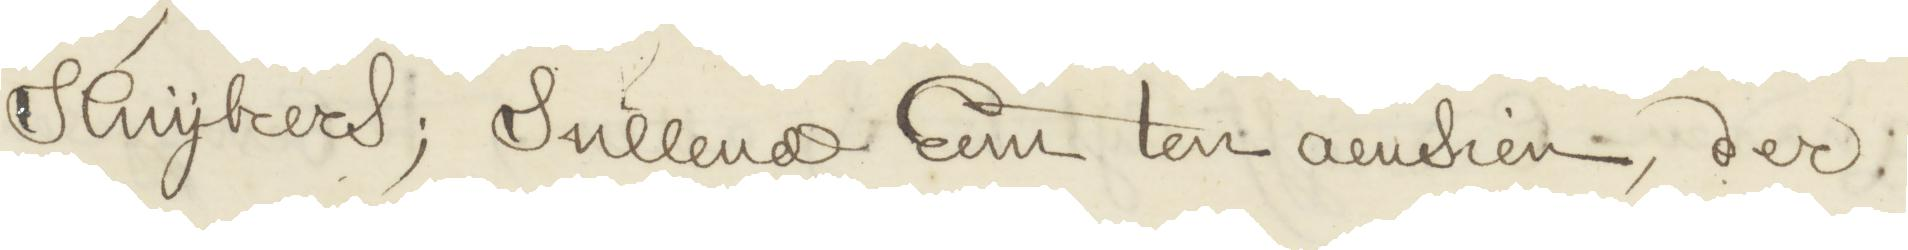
sluikers; sullende hem ten aensien, der
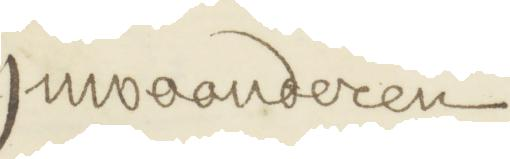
jnwoonderen
